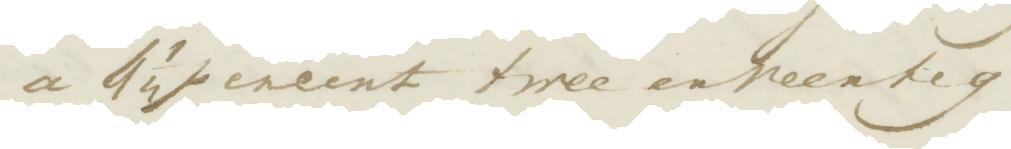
a 4¼ percent twee en veertig
